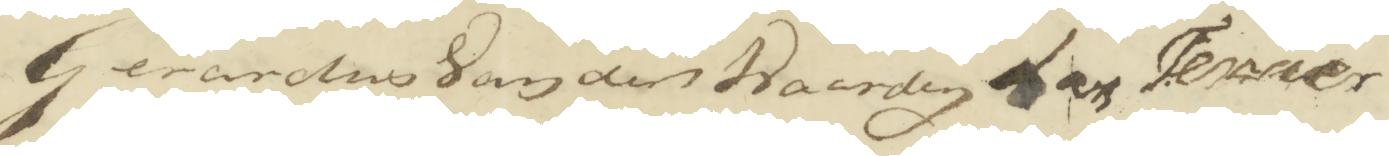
Gerardus van der Waarden Ian Tessier
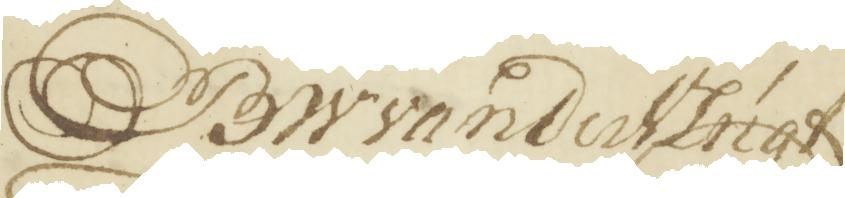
BW vanderVlugt
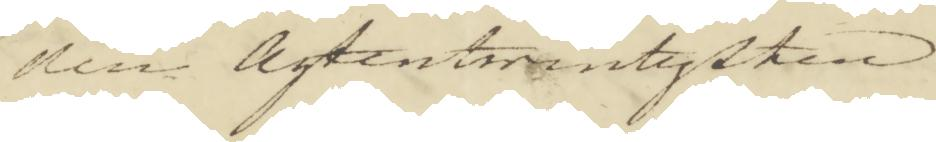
den Agtentwintigsten
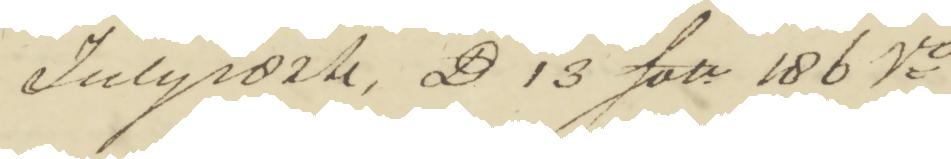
July1824, D 15 fol.o 186 V=o
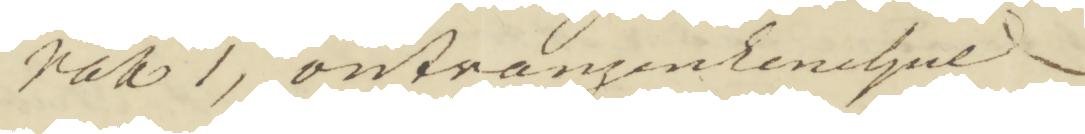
vak 1, ontvangenEeneGul-
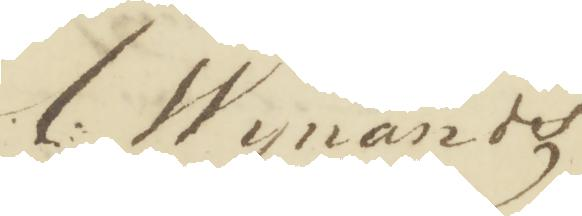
C. Wynands
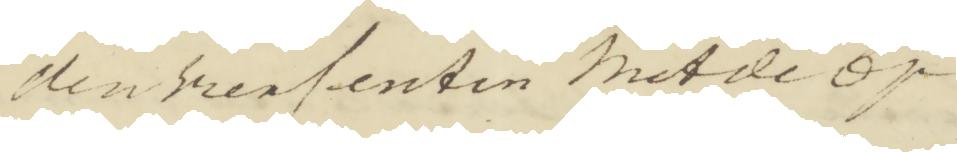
den vierCenten met de op
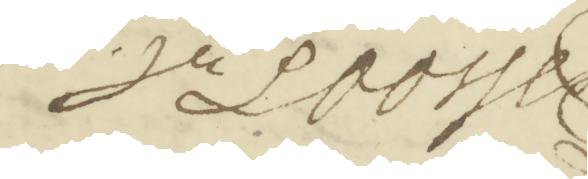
I.n looyes
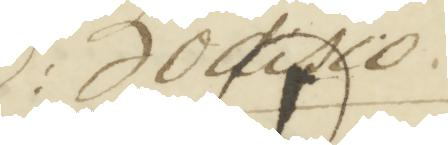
P: Bodisco
